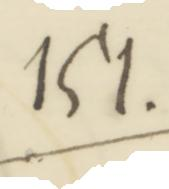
151.
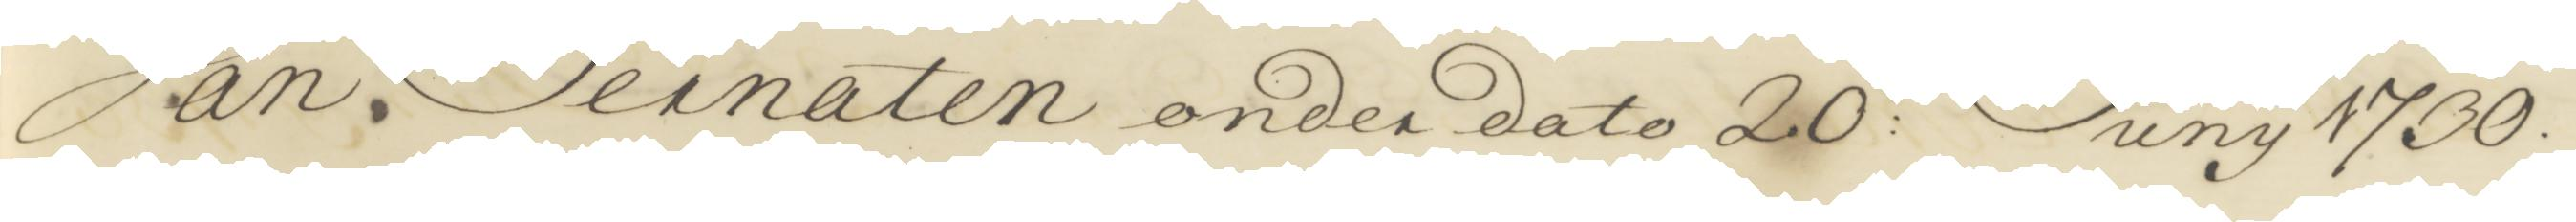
Van Ternaten onder dato 20:' Iunij 1730.
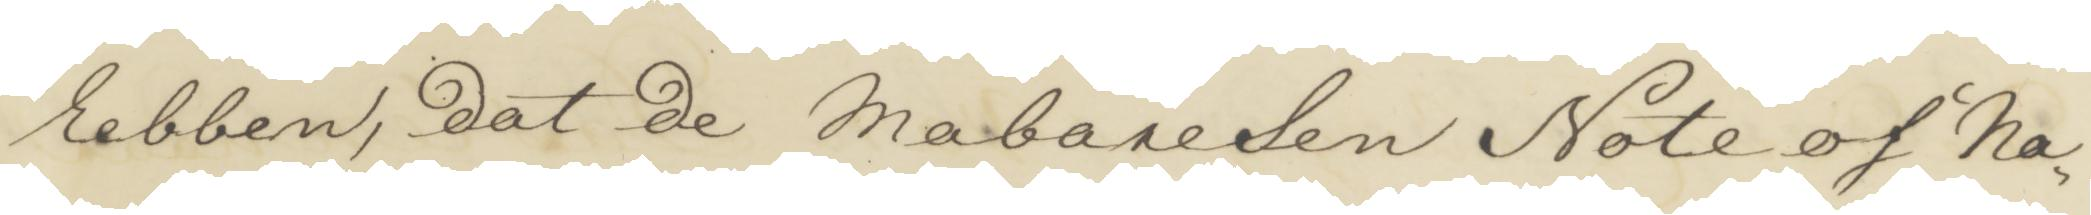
hebben, dat de mabaresen Note of na„
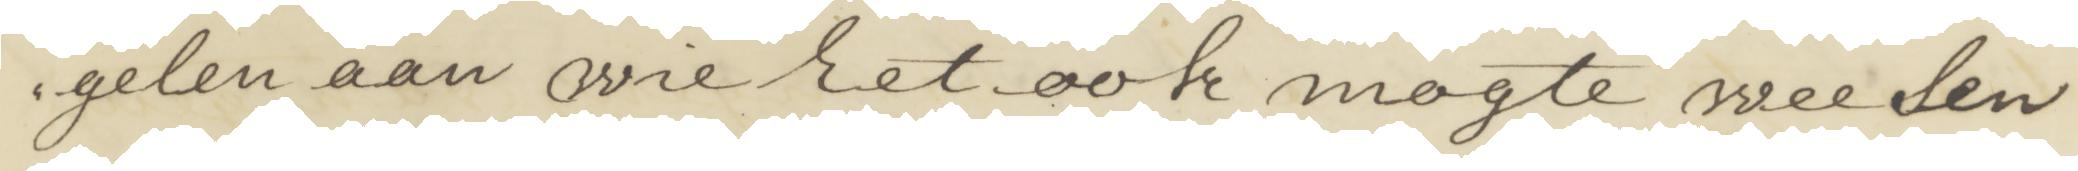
„gelen aan wie het ook mogte weesen
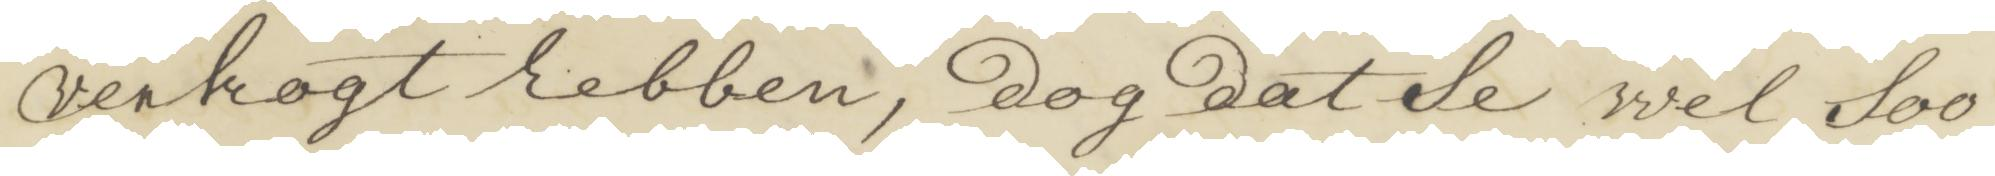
verkogt hebben, dog datse wel soo
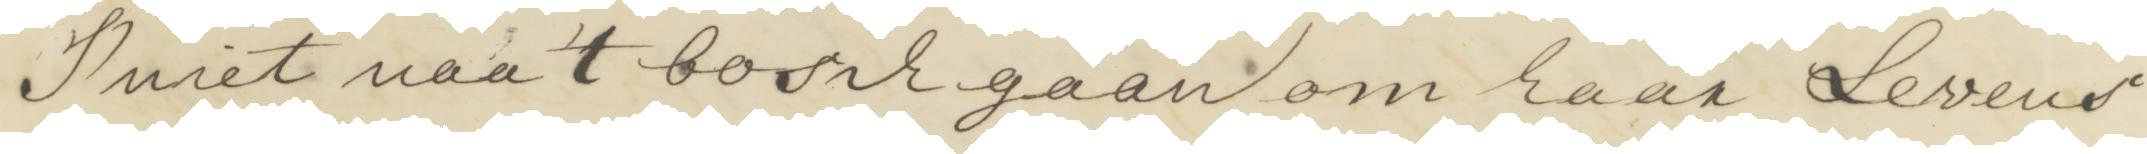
s' niet naa ’t bosch gaan om haar Levens
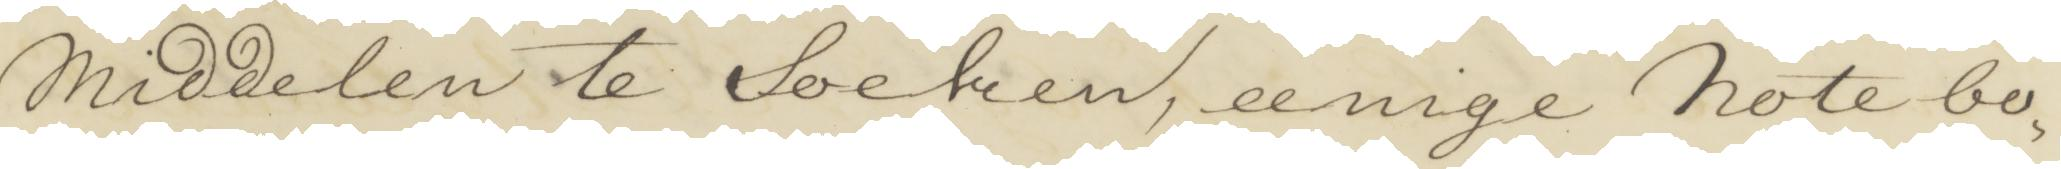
Middelen te soeken, eenige note be„
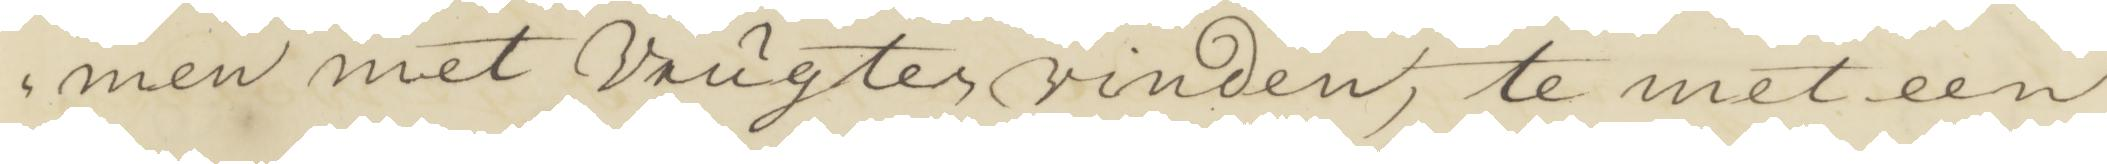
„men met vrugten vinden, te met een
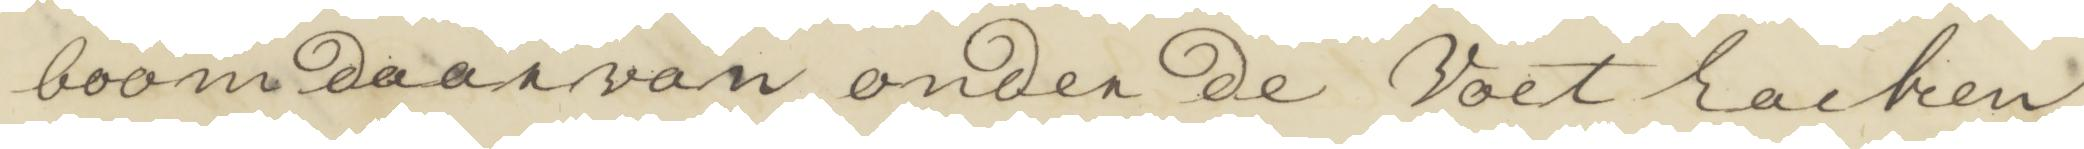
boom daar van onder de Voet hacken
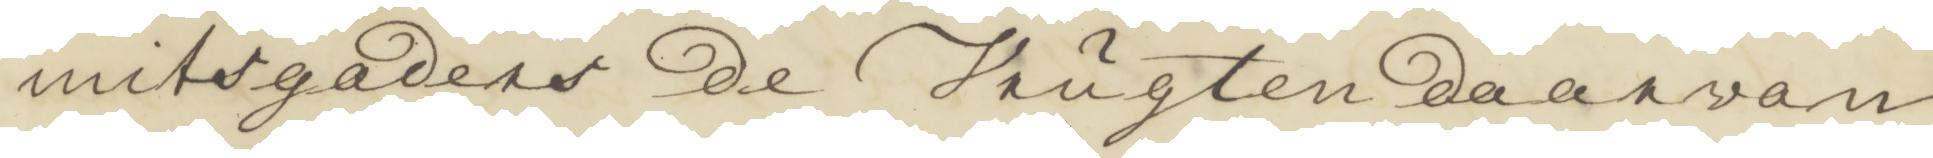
mitsgaders de Vrugten daarvan
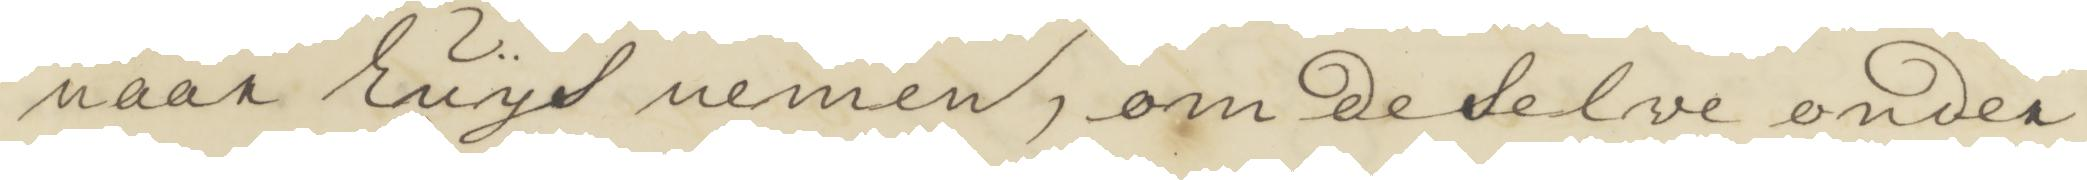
naar huijs nemen, om deselve onder
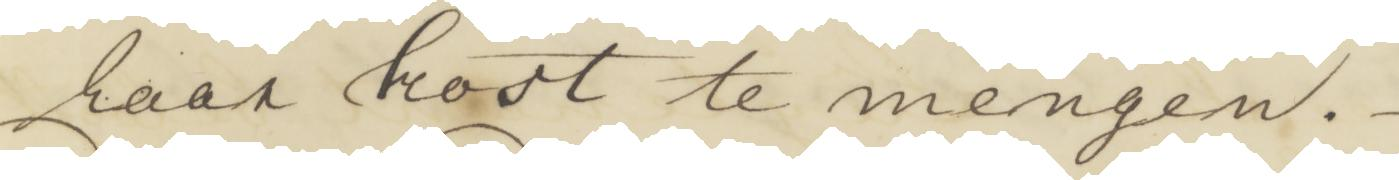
haar kost te mengen.
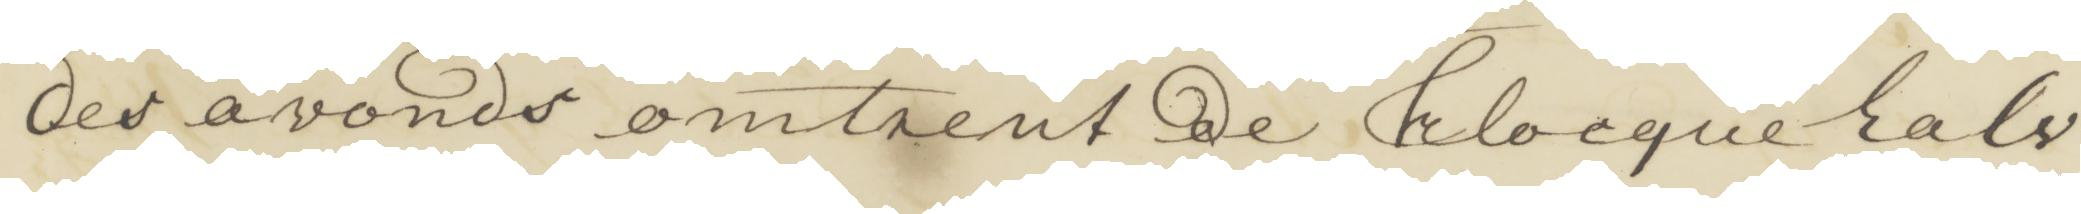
des avonds omtrent de klocque halv
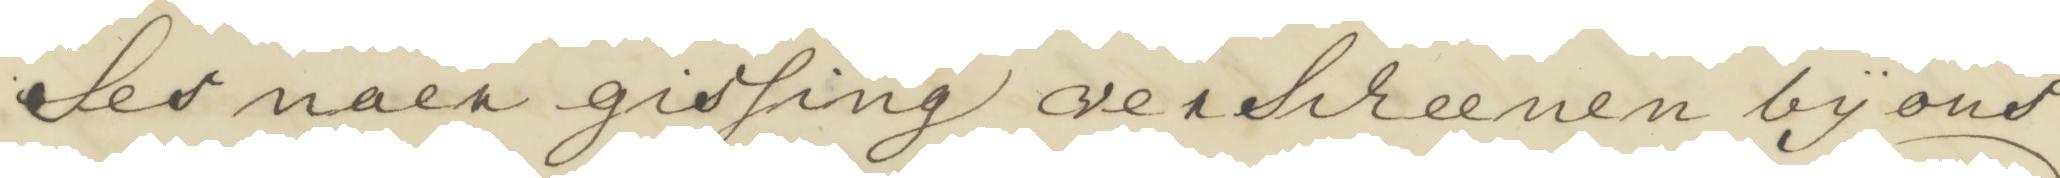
ses naer gissing verscheenen bij ons
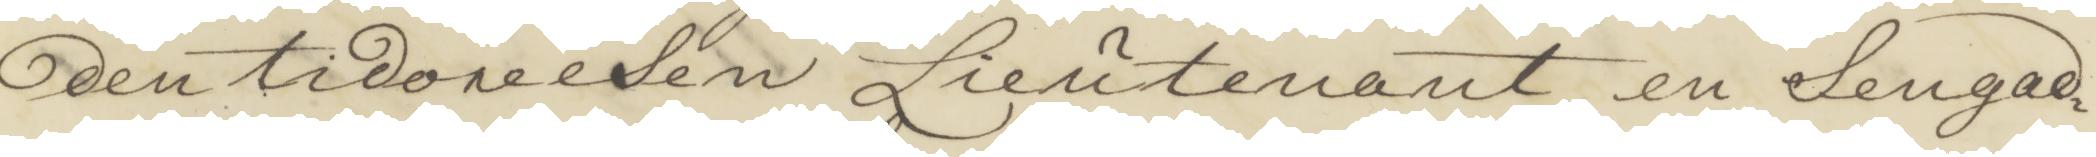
den tidoreesen Lieutenant en sengad„
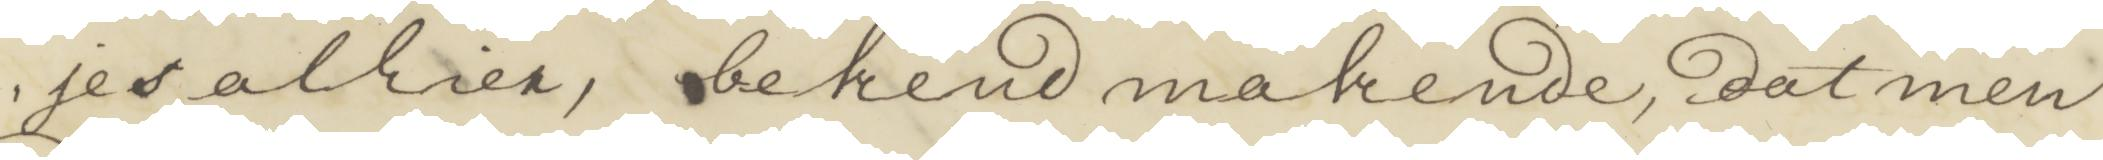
„jes alhier, bekend makende, dat men
